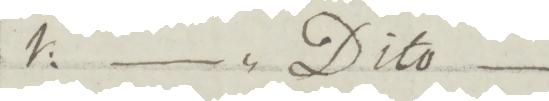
1: —„ Dito —
